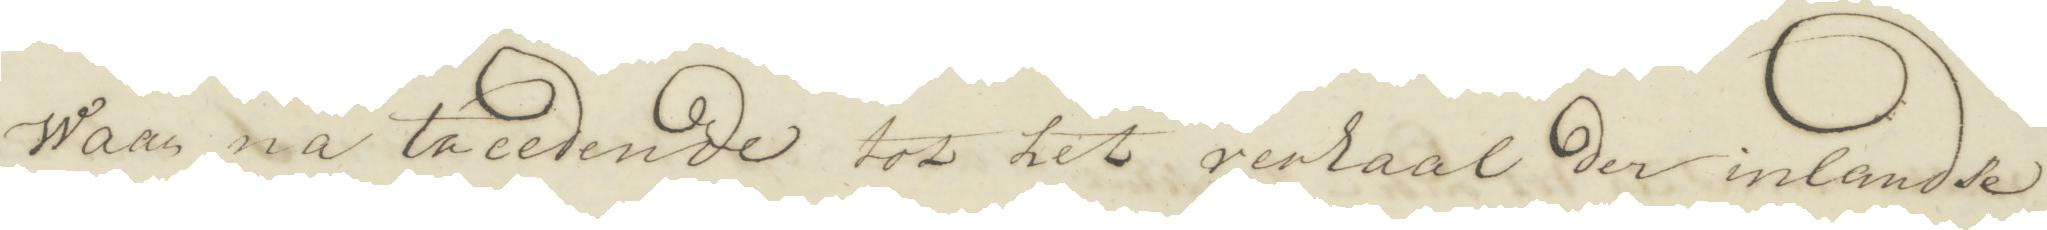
waar na treedende tot het verhaal der inlandse
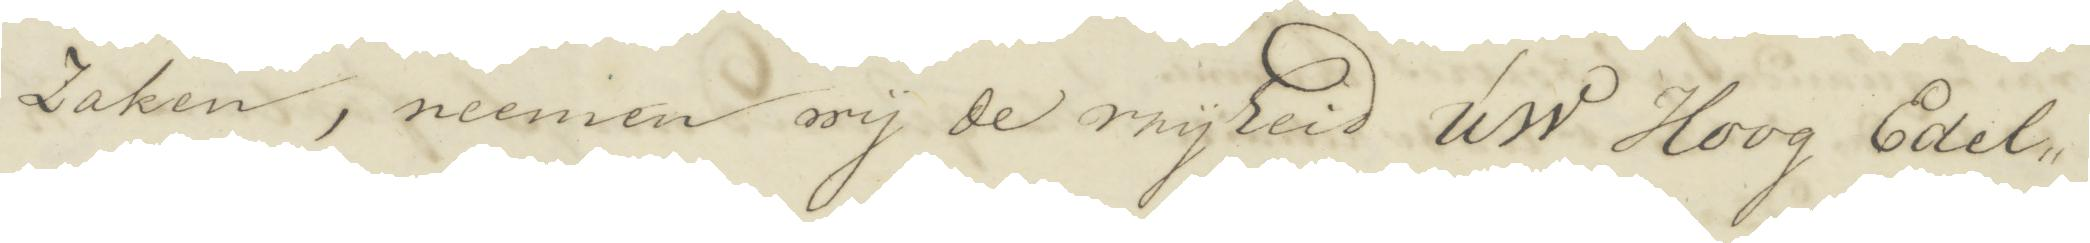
zaken, neemen wij de vrijheid uw Hoog Edel„
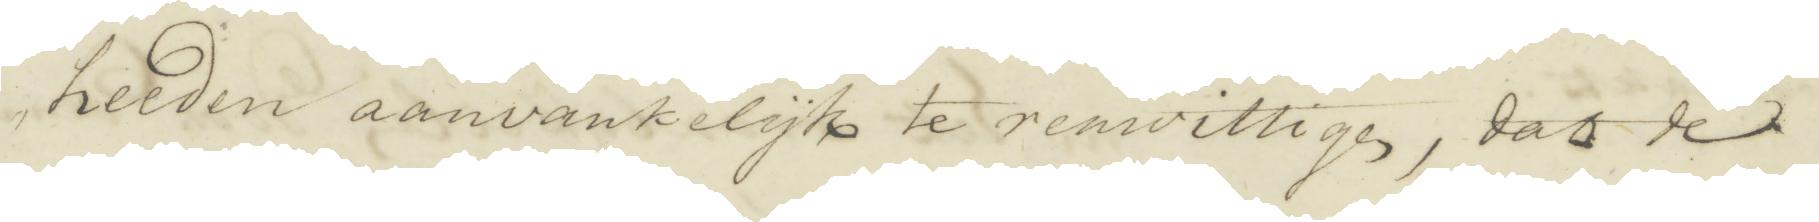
„heeden aanvankelijk te verwittigen, dat de.
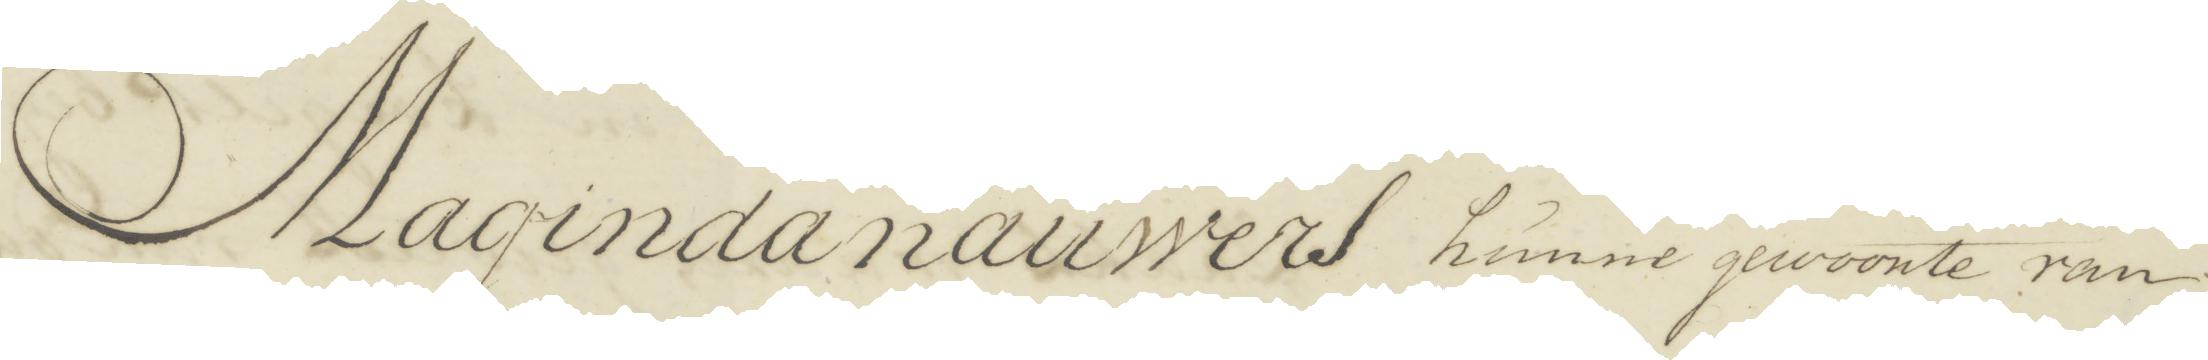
Magindanauwers hunne gewoonte van
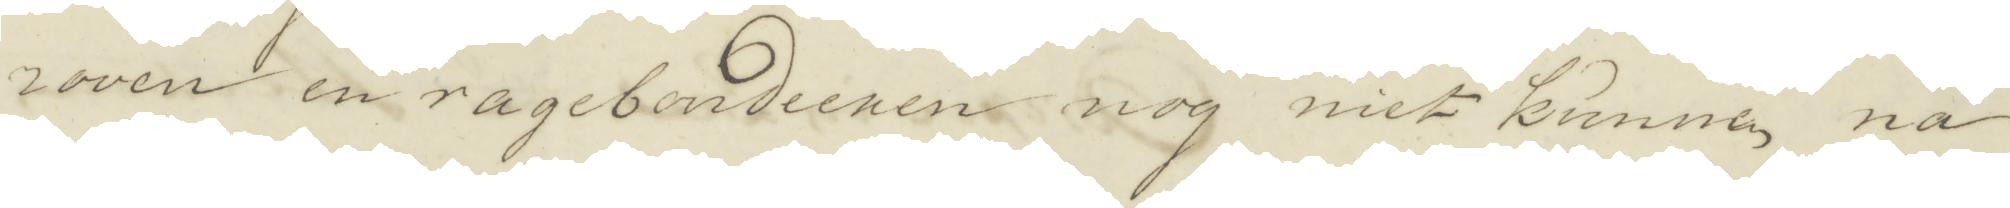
roven en vagebondeeren nog niet kunnen na
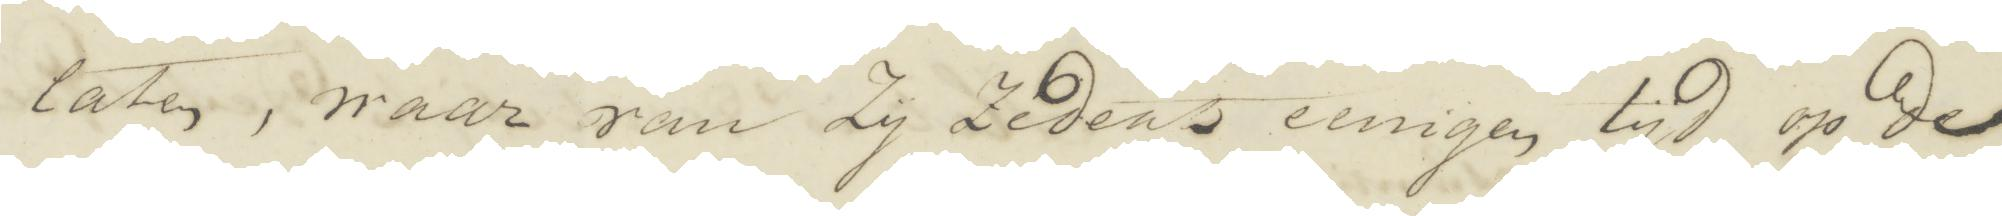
laten, waar van zij zedert eenigen tijd op de
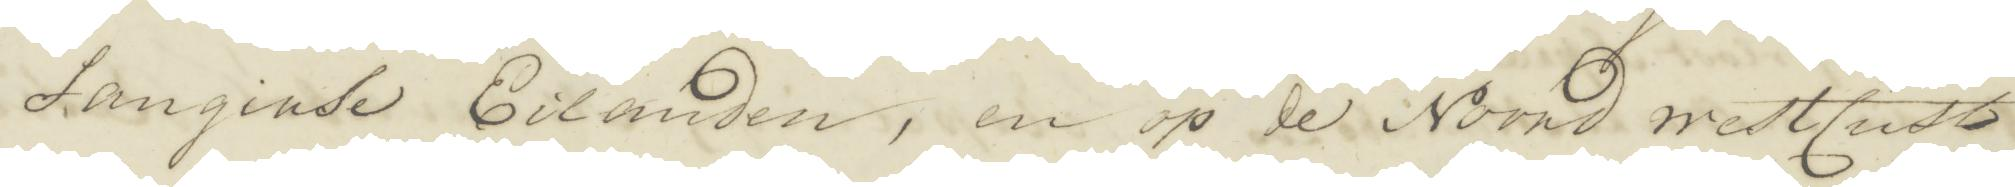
sangirse Eilanden, en op de Noord west cust
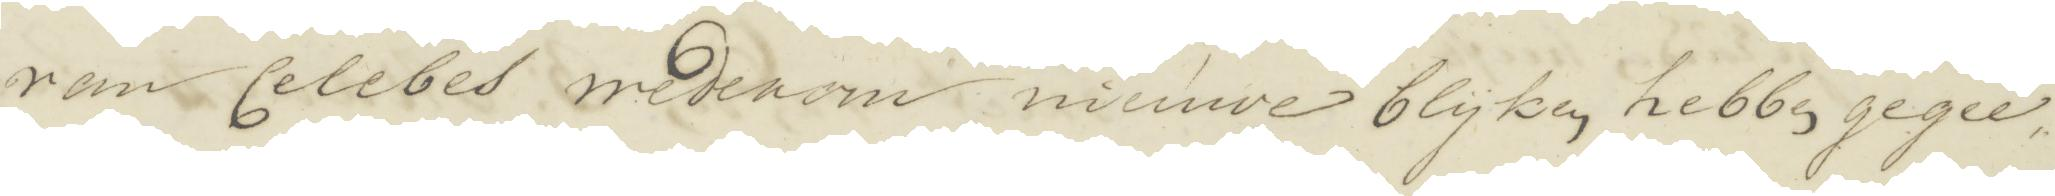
van Celebes wederom nieuwe blijken hebben gegee
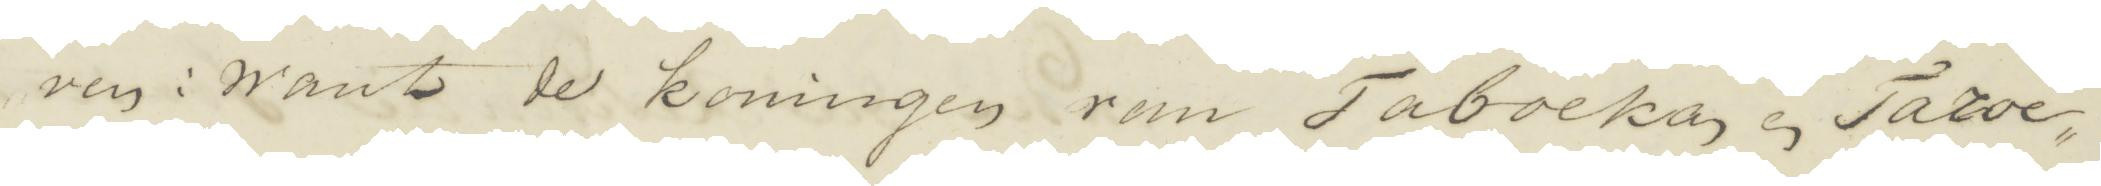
„ven: want de koningen van Taboekan en Taroe„
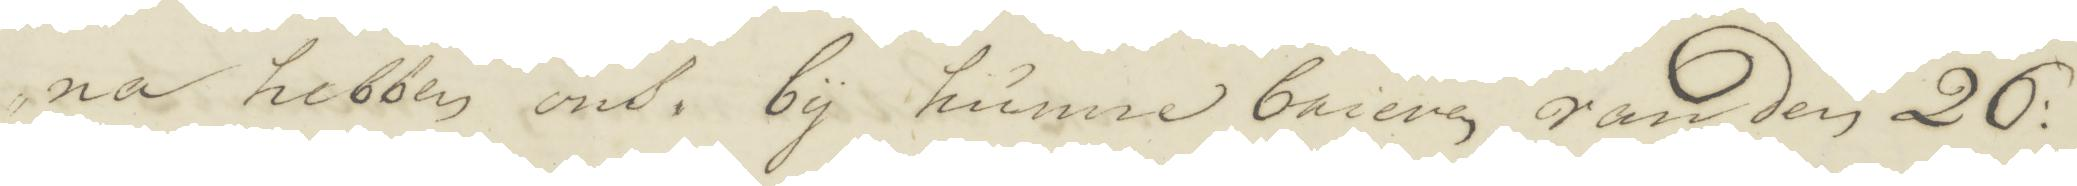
„na hebben ons, bij hunne brieven van den 26:
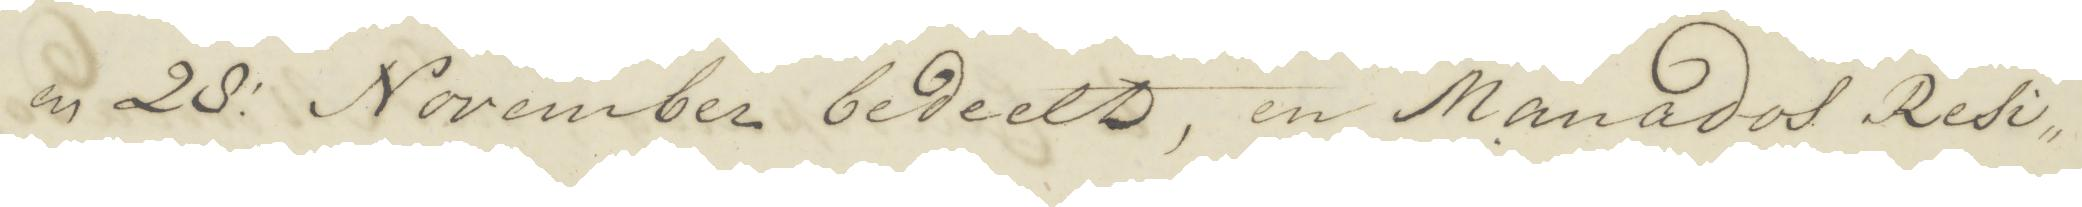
en 28: November bedeelt, en Manados Resi„
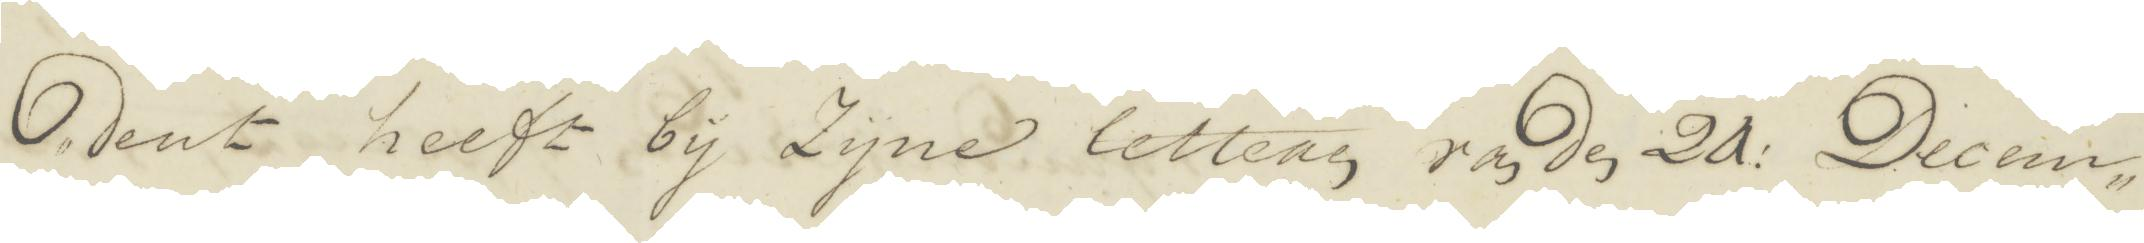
„dent heeft bij zijne letteren van den 24: Decem„
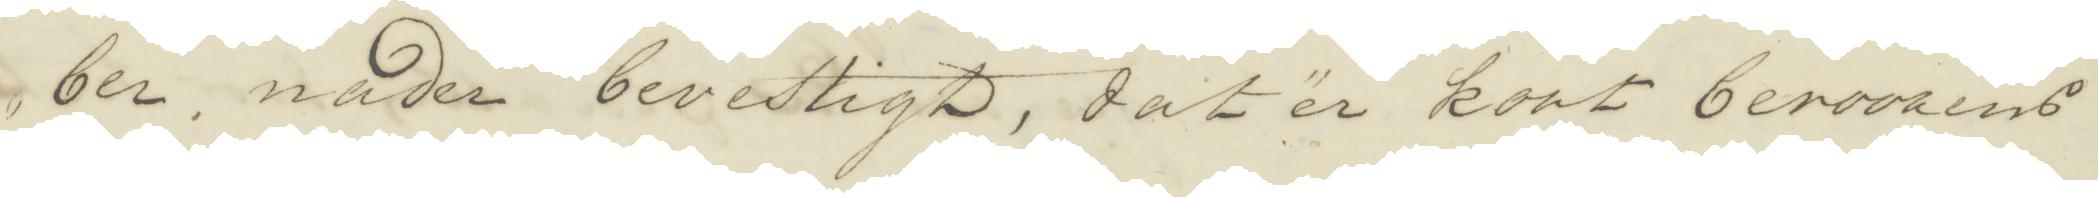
„ber, nader bevestigt, dat ër kort bevoorens
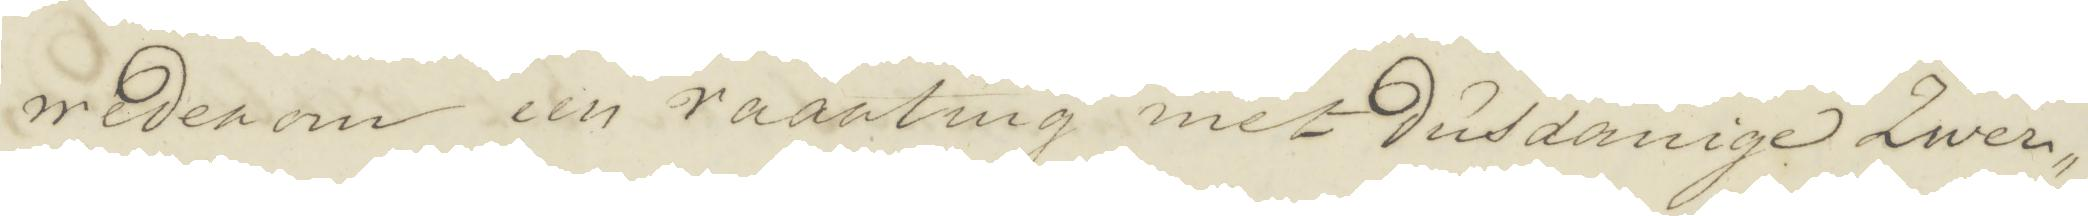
wederom een vaartuig met dusdanige zwer„
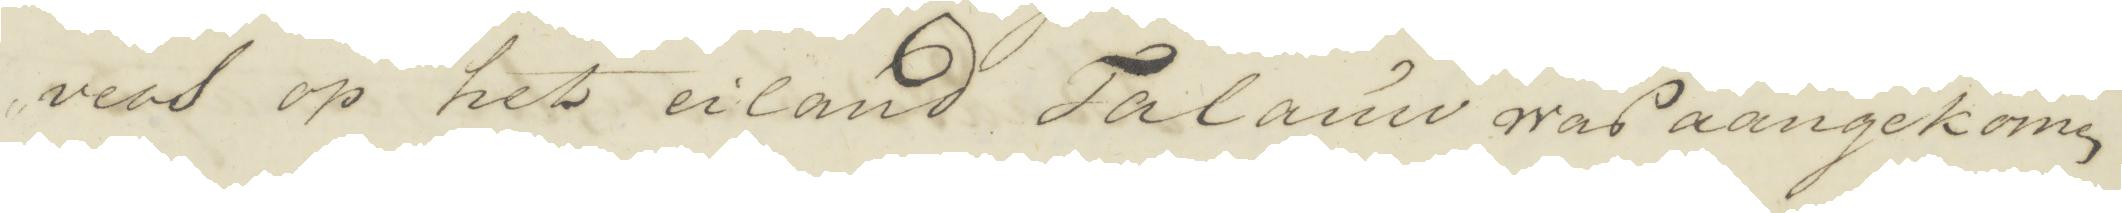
„vers op het eiland Talauw was aangekomen
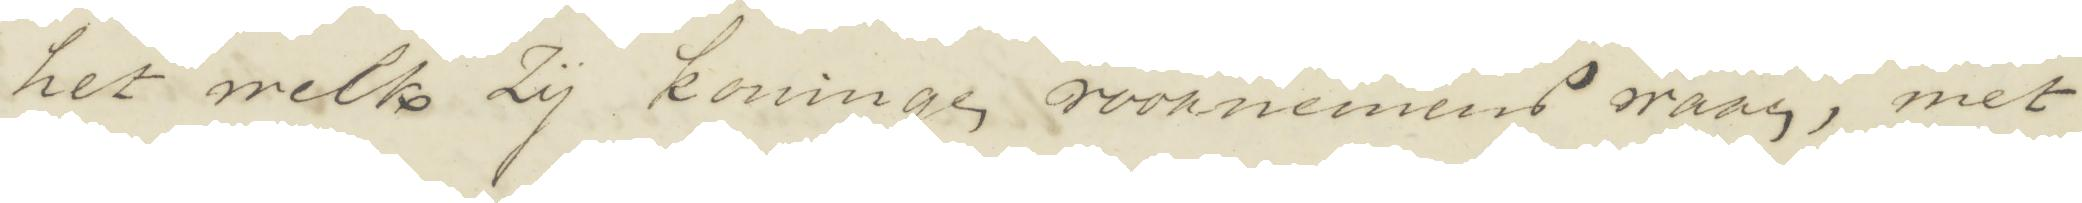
het welk zij koninge voornemens waren, met
